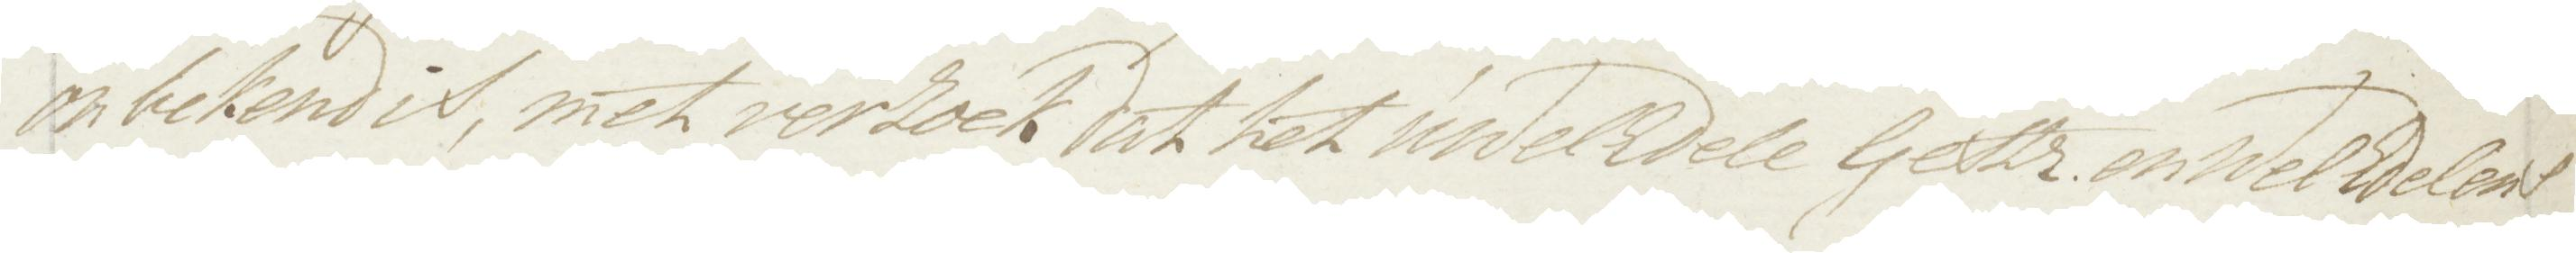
onbekend is, met verzoek dat het uwel Edele Gestr: en wel Edelens
